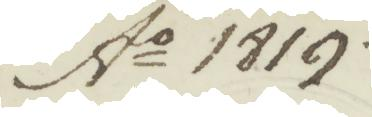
A=o 1819
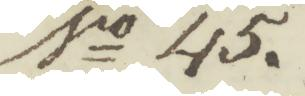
N=o 45.
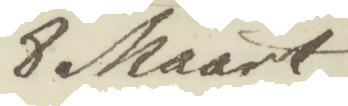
8 Maart
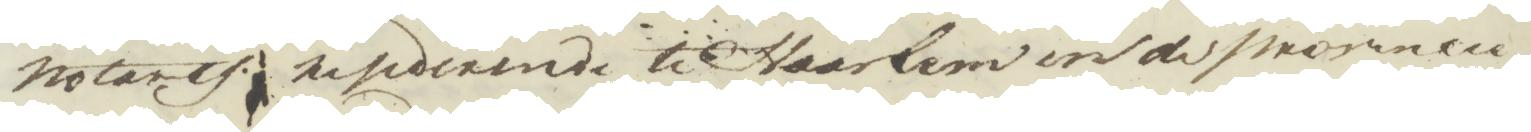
notaris residerende te Haarlem in de provincie
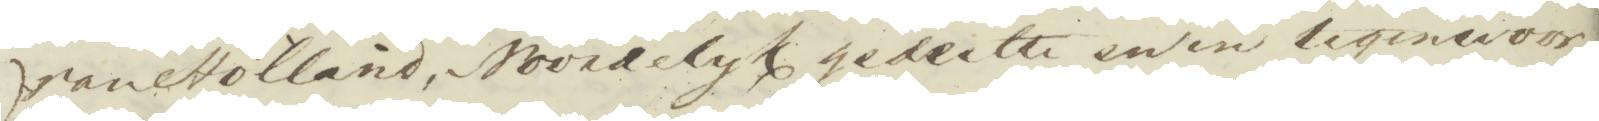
van Holland, Noordelyk gedeelte en in tegenwoor
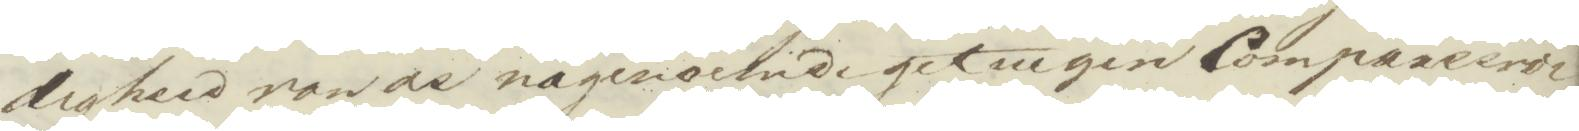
digheid van de nagenoemde getuigen Compareerde
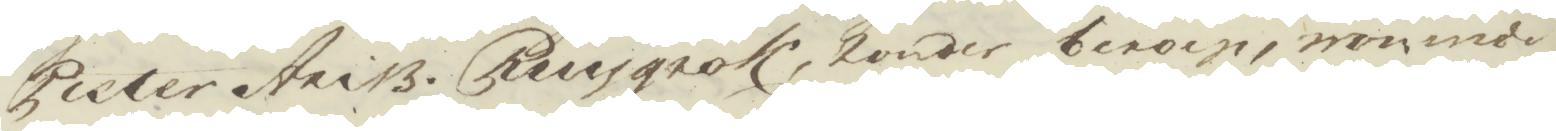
Pieter Aritz. Ruygrok, zonder beroep, wonende
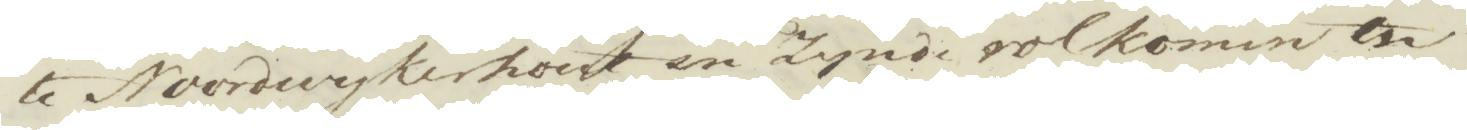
te Noordwykerhout en zynde volkomen in
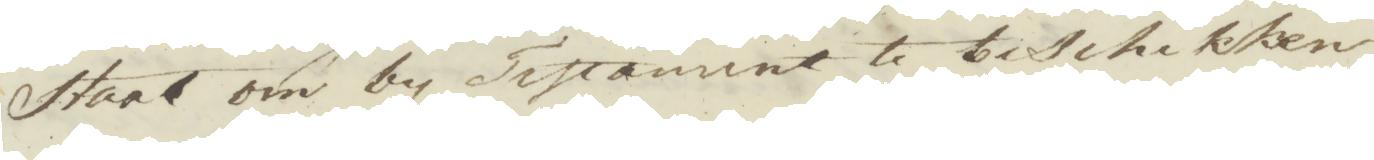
staat om by Testament te beschikken
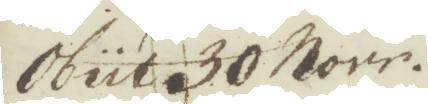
Obiit 30 Novr.
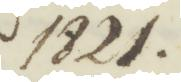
1821.
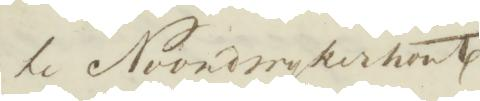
te Noordwykerhout
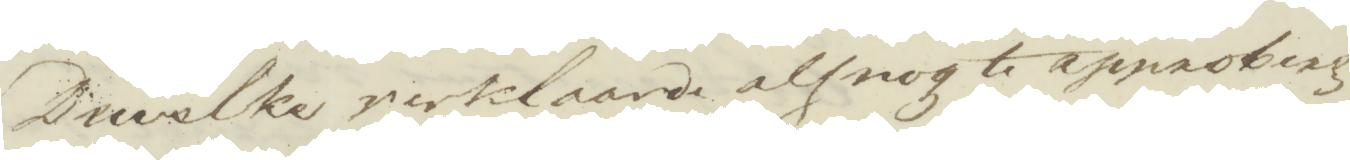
Dewelke verklaarde als nog te approberen
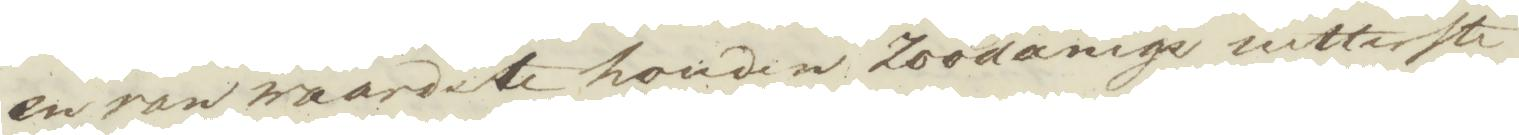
en van waarde te houden zoodanige uitterste
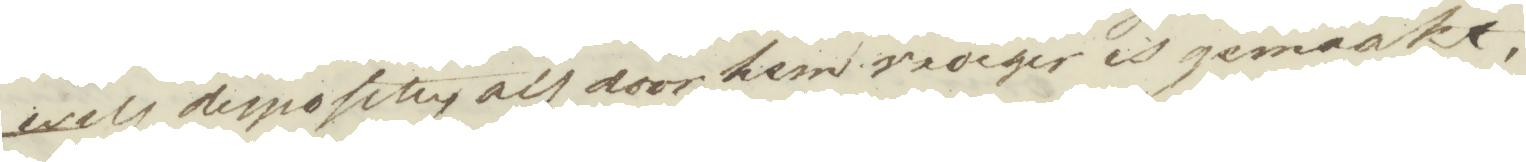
wils dispositie als door hem vroeger is gemaakt,
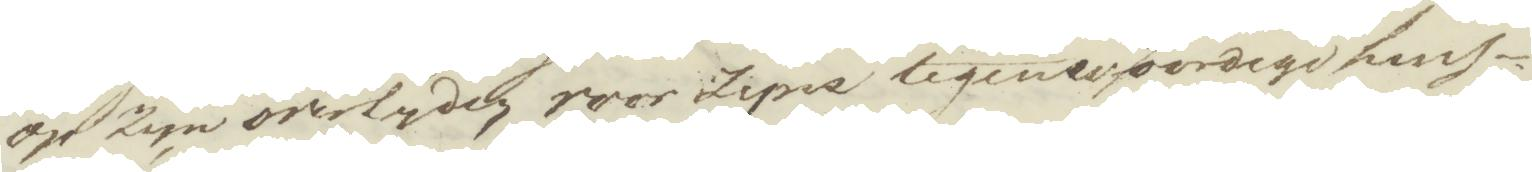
op zyn overlyden voor zyne tegenwoordige huis-
